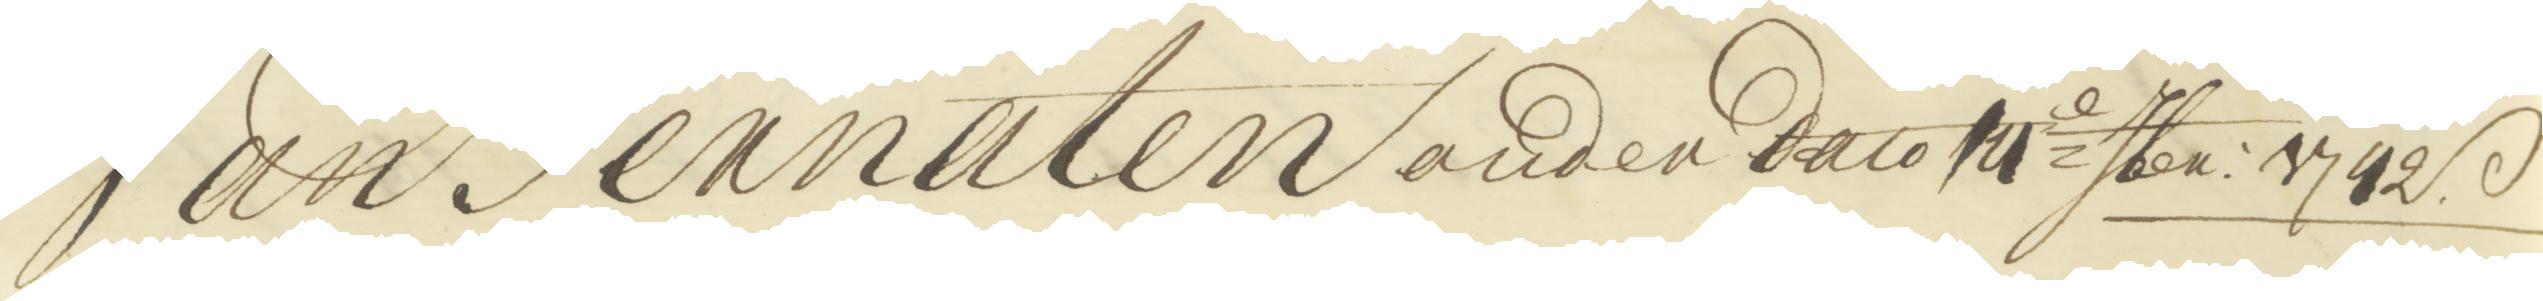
Van Ternaten onder dato 14=e 7ber: 1742.
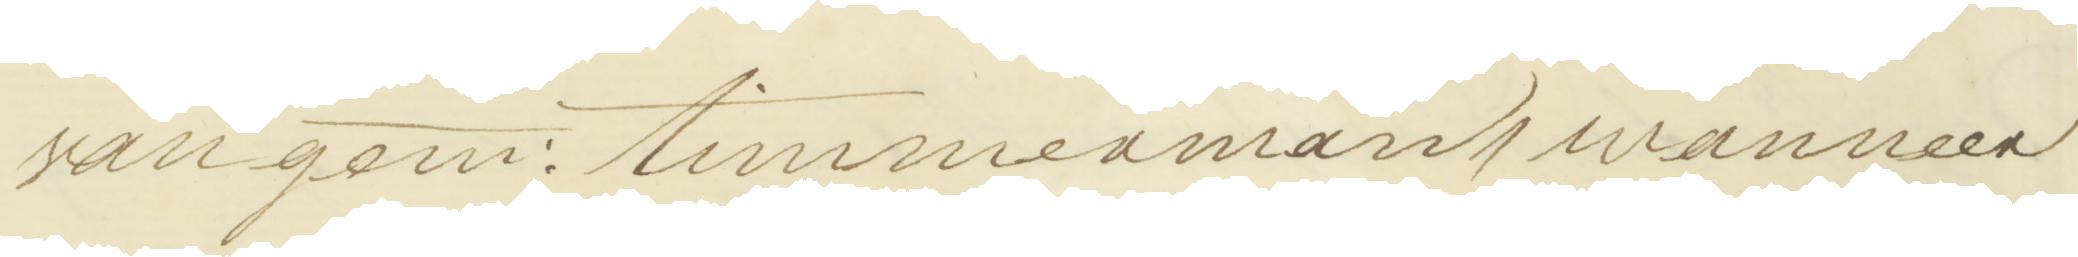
van gem: timmerman, wanneer
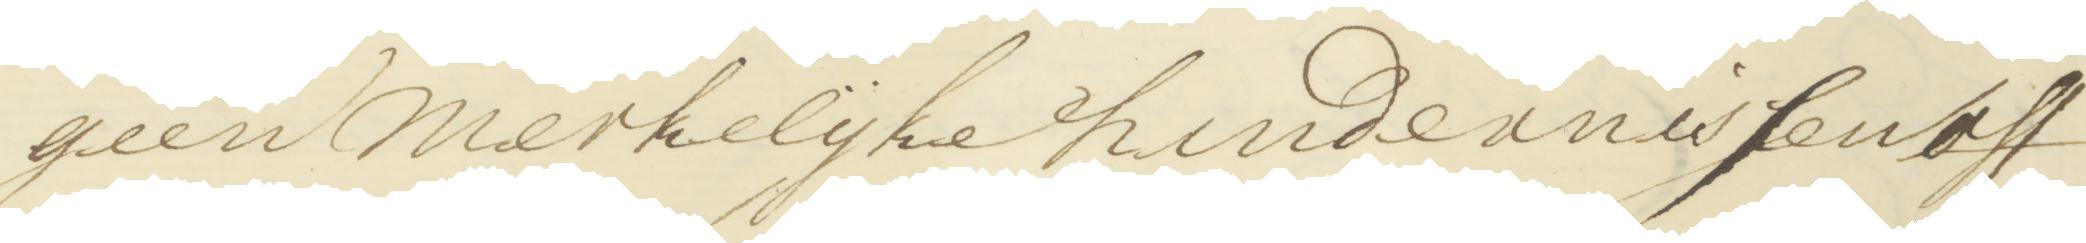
geen merkelijke hindernissen off
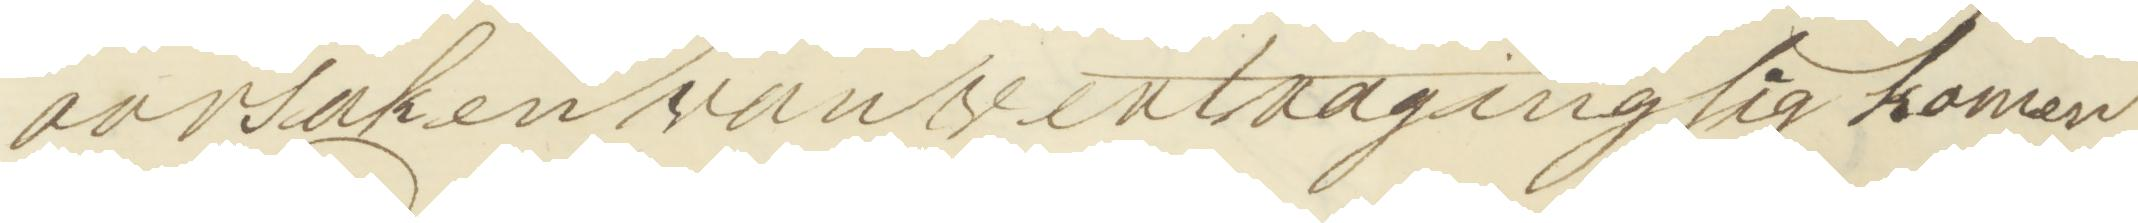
oorsaken van vertraging sig komen
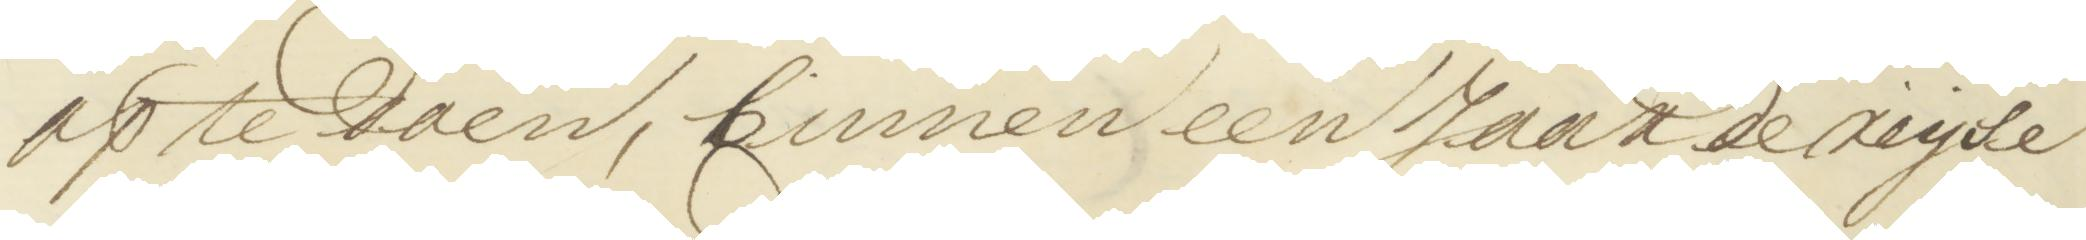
op te doen, binnen een Jaar de reijse
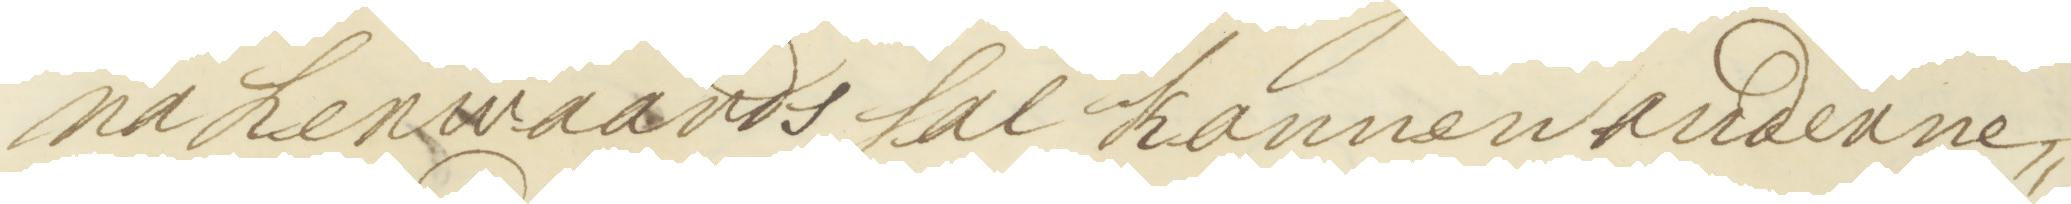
na herwaards sal konnen onderne„
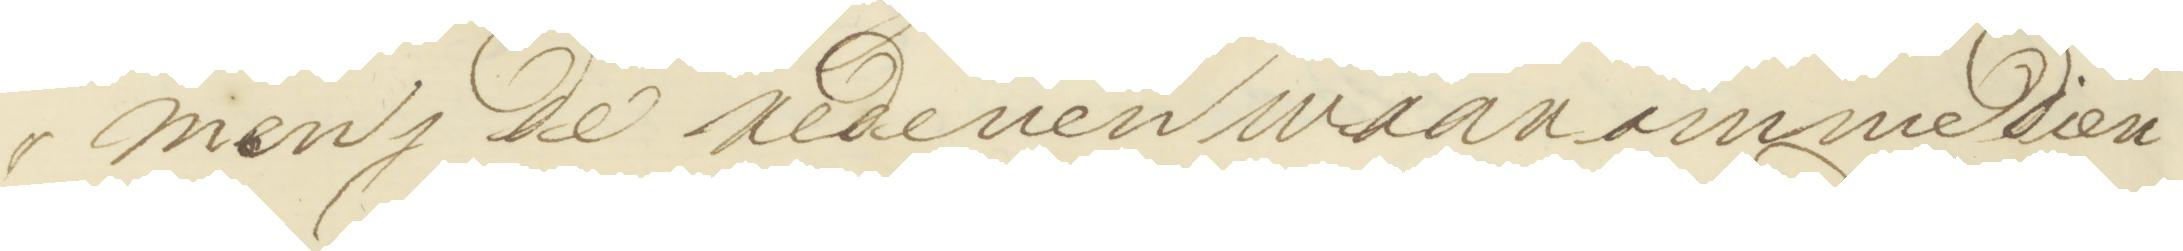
men, de redenen waaromme dien
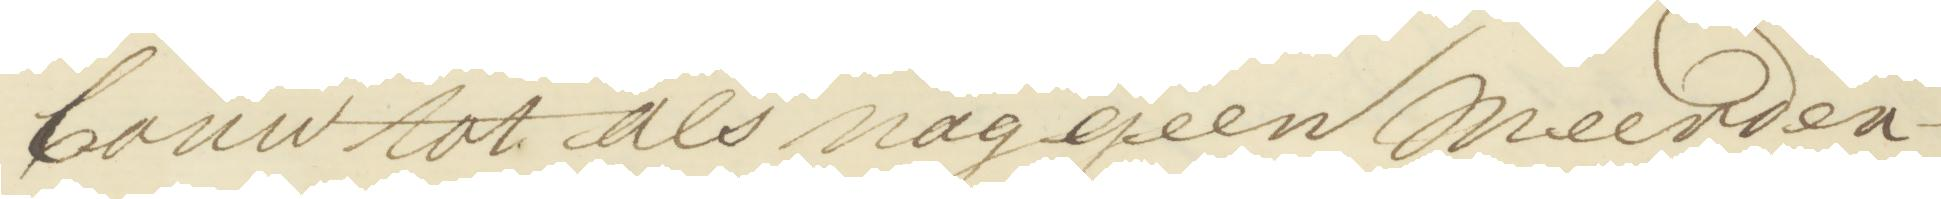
bouw tot als nog geen meerder
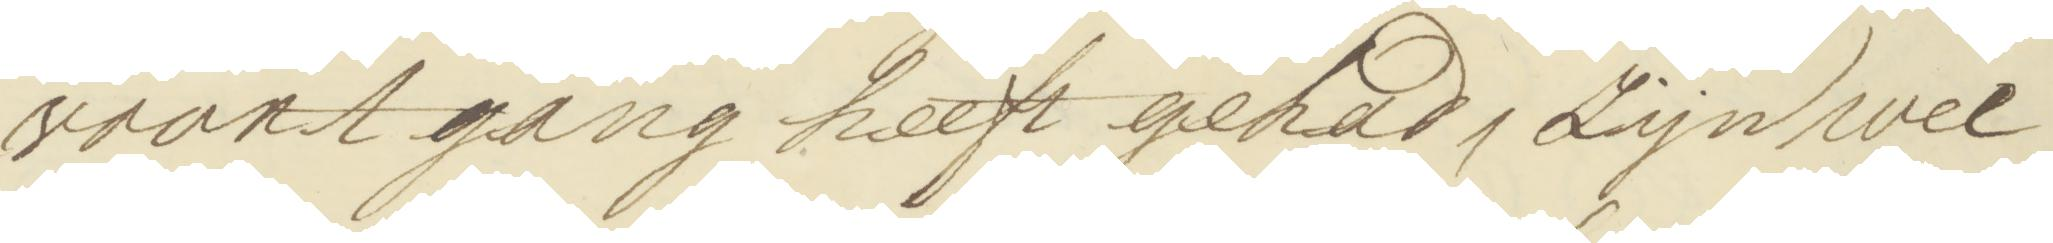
voortgang heeft gehad, zijn wel
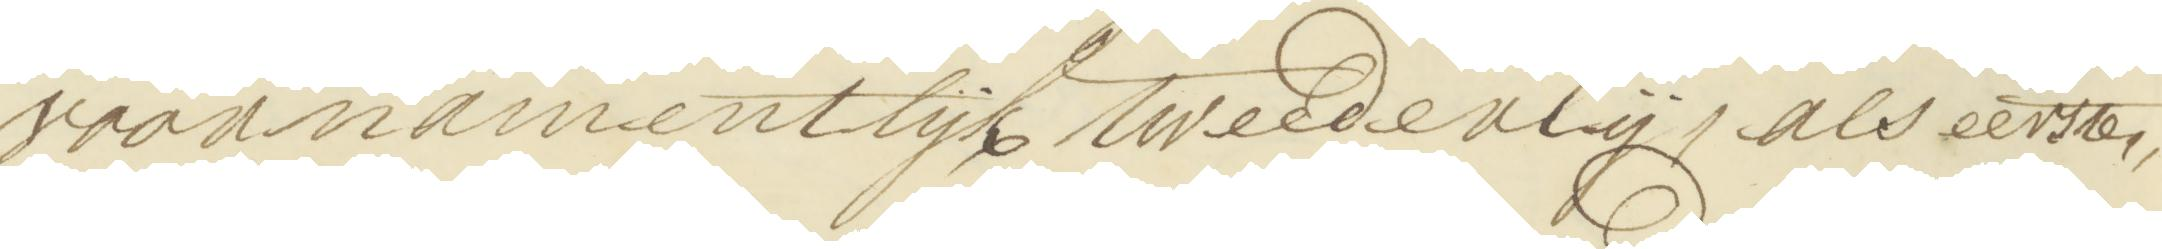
voornamentlijk tweederlij, als eerste„
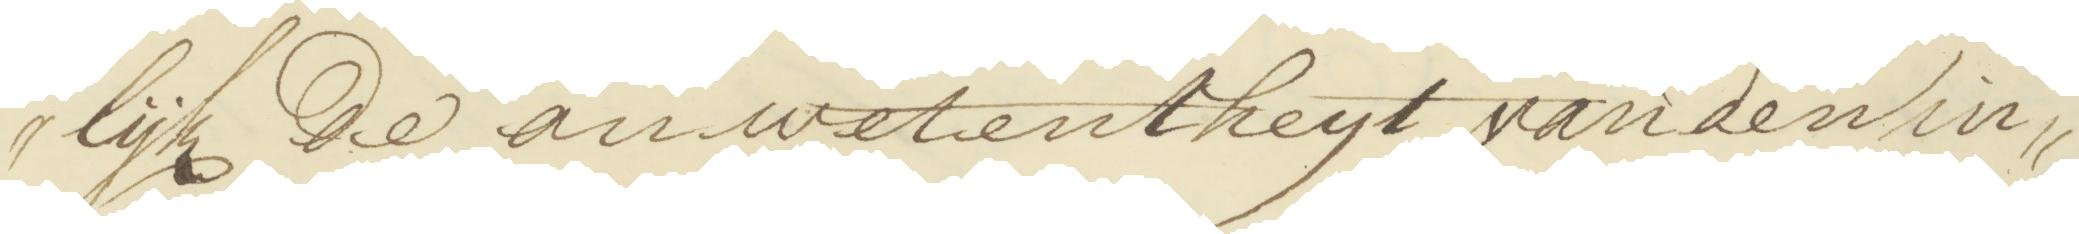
„lijk de onwetentheijt van den in„
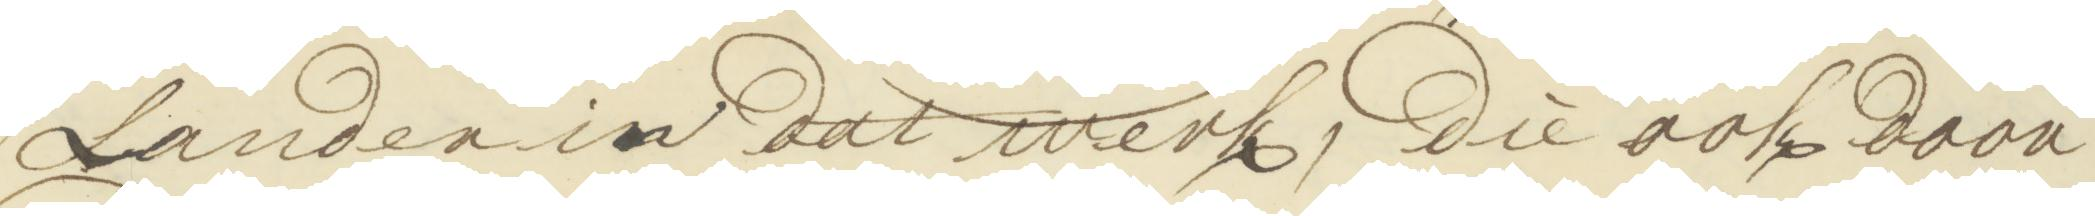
Lander in dat werk, die ook door
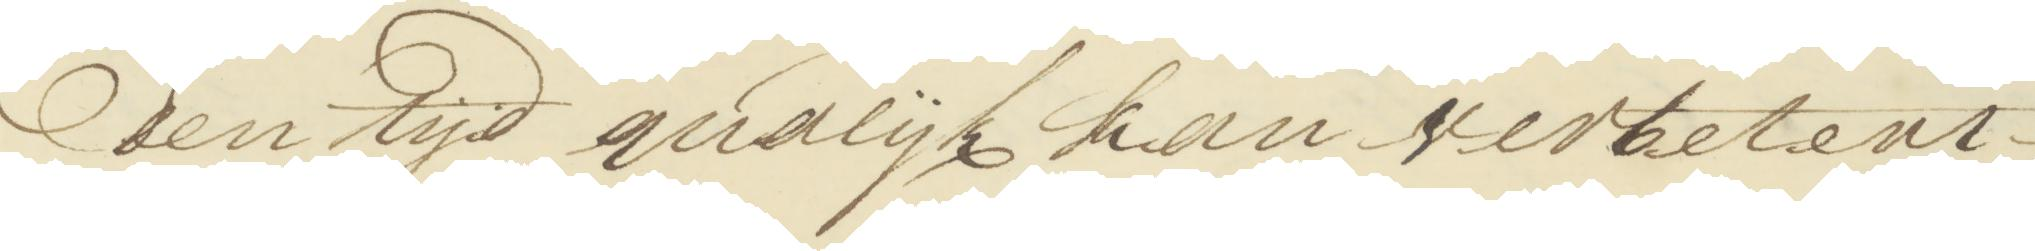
den tijd qualijk kan verbetert
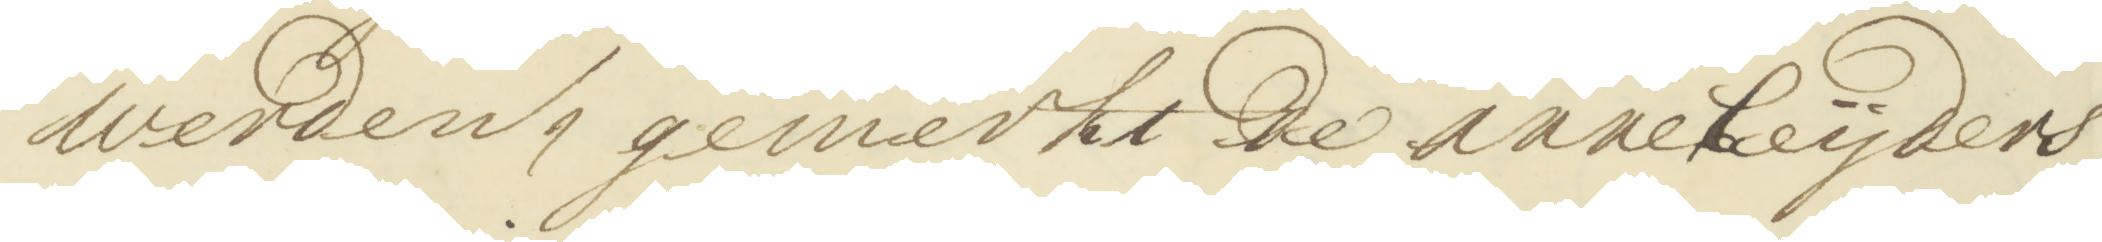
werden, gemerkt de arrebeijders
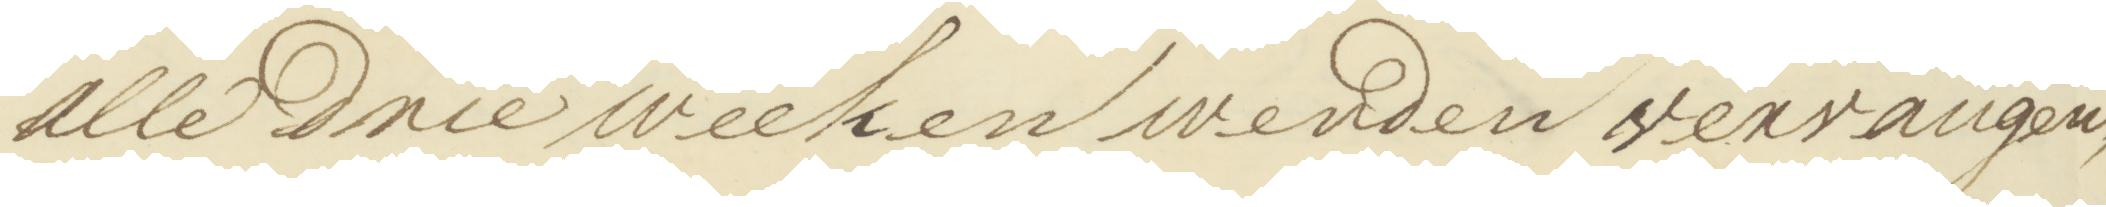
alle drie weeken werden vervangen
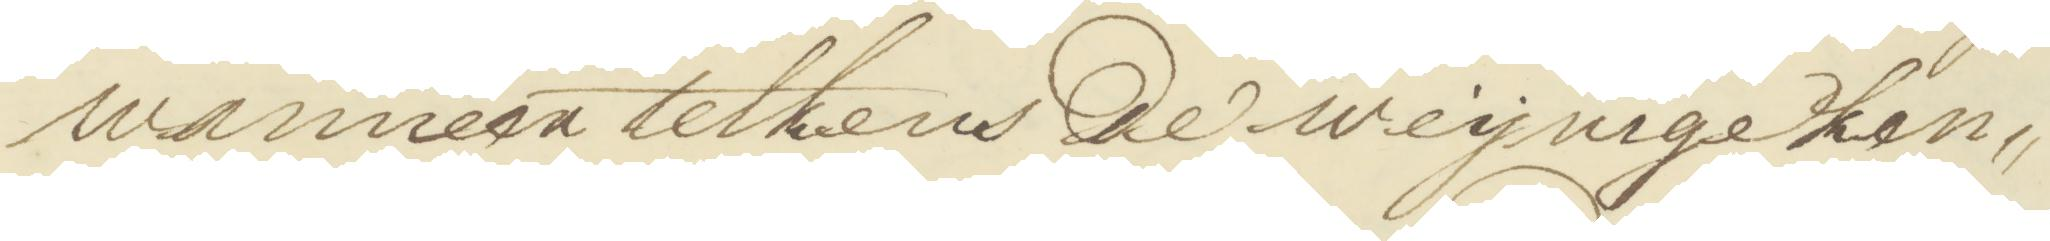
wanneer telkens de weijnige ken„
